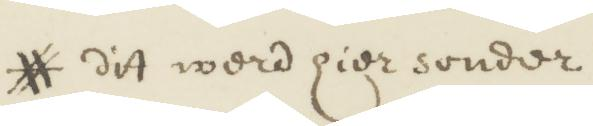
dit werd hier sonder
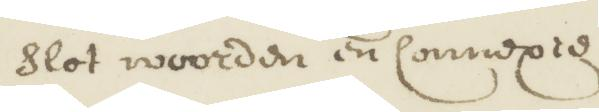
slot woorden en Connexie
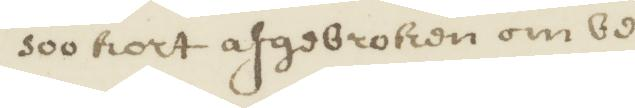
soo kort afgebroken om be
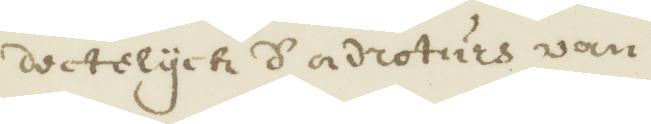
dectelijck d' adroturs van
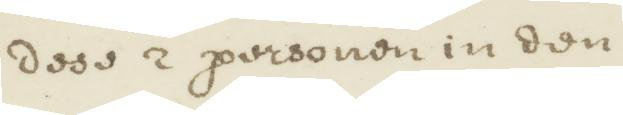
dese 2 personen in den
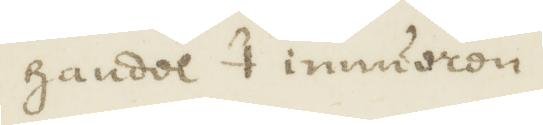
handel 't innueren
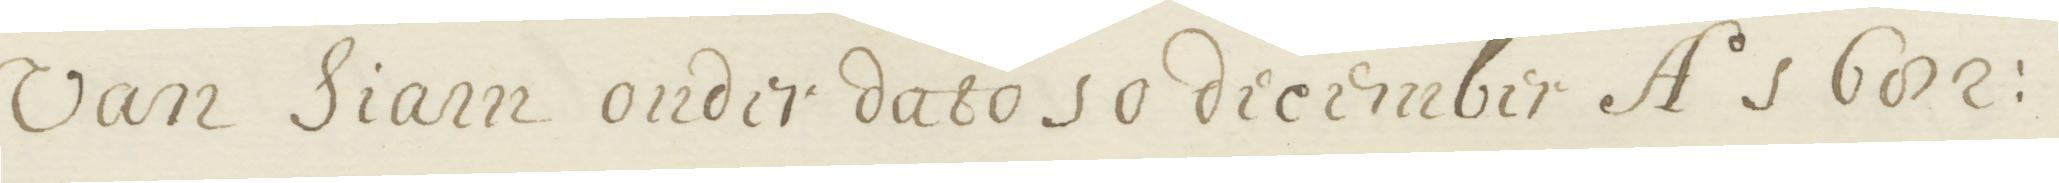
Van Siam onder dato 10 december Ao 1682:
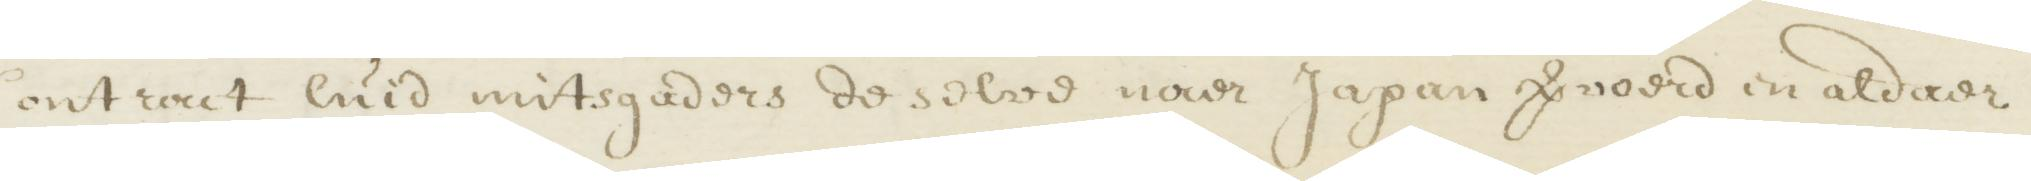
Contract luid mitsgaders de selve naer Japan vervoerd en aldaer
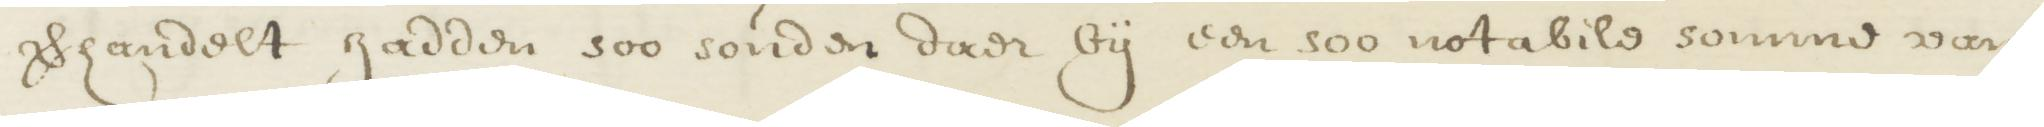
verhandelt hadden soo souden daer bij een soo notabile somme van
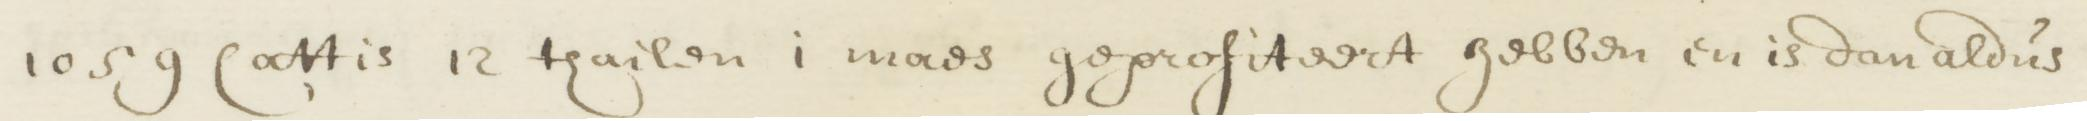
1059 Cattis 12 thailen 1 maes geprofiteert hebben en is dan aldus
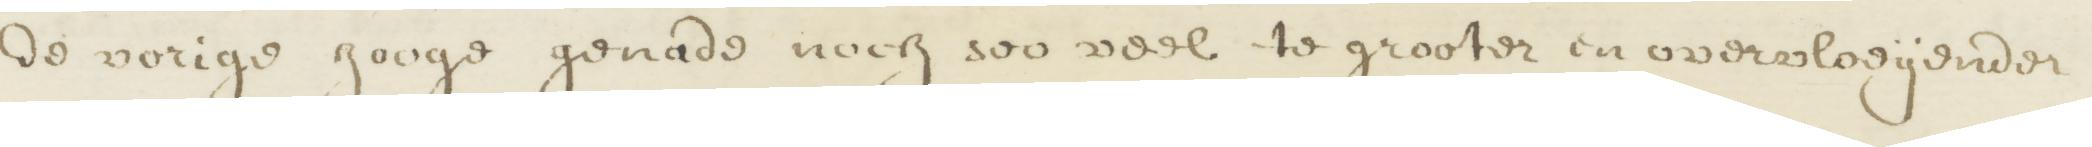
de vorige hooge genade noch soo veel te grooter en overvloeijender
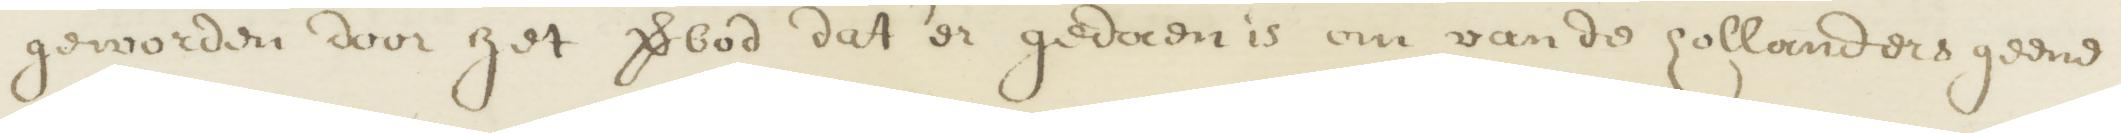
geworden door het verbod dat 'er gedaen is om van de hollanders geene
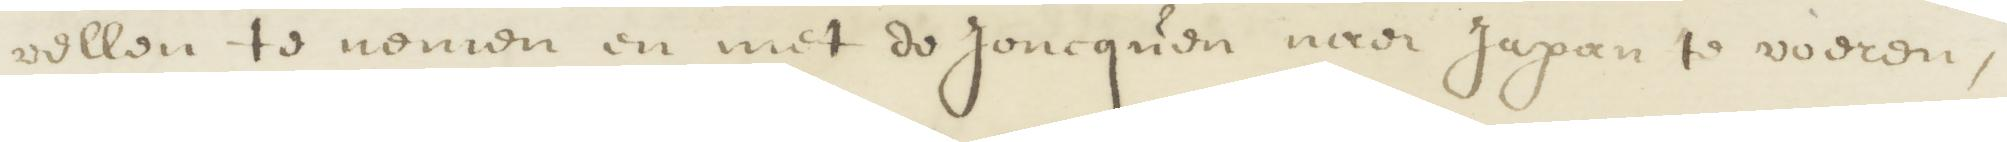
vellen te nemen en met de Joncquen naer Japan te voeren,
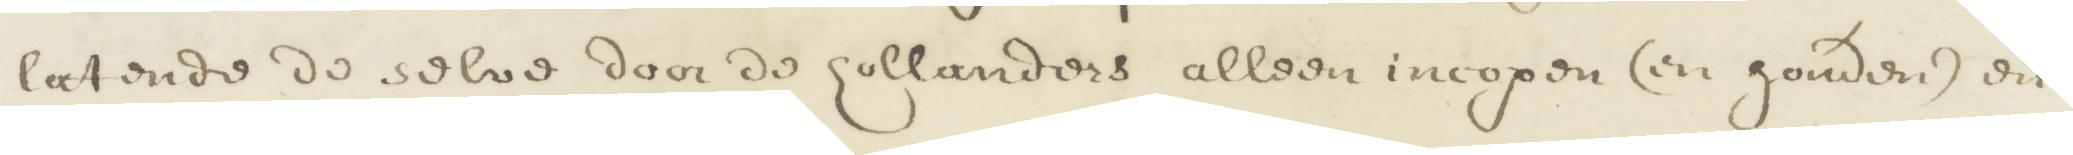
latende de selve door de hollanders alleen incopen (en houden) en
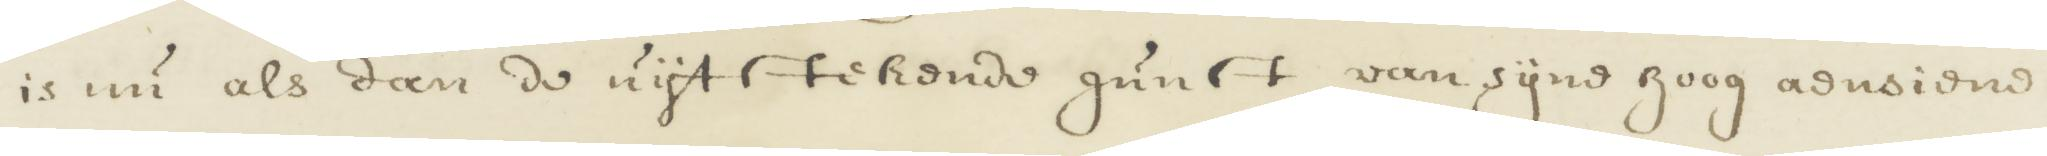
is nu als dan de uijtstekende gunst van sijne hoog aensiene
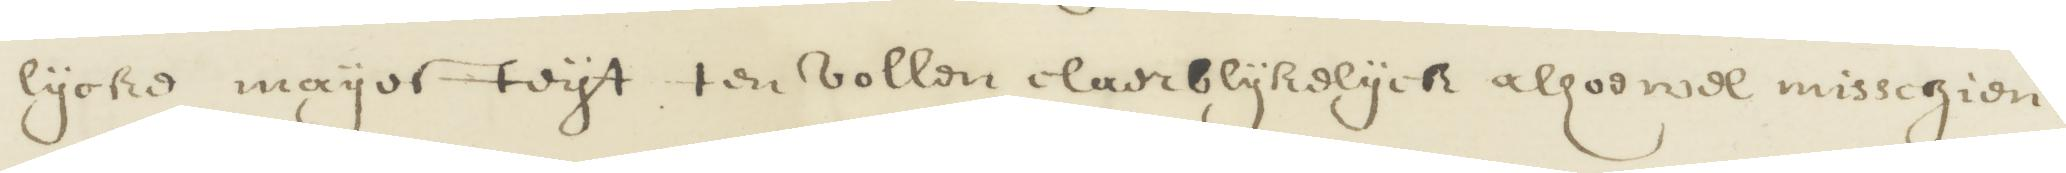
lijcke maijesteijt ten vollen claerblijkelijck alhoewel misschien
